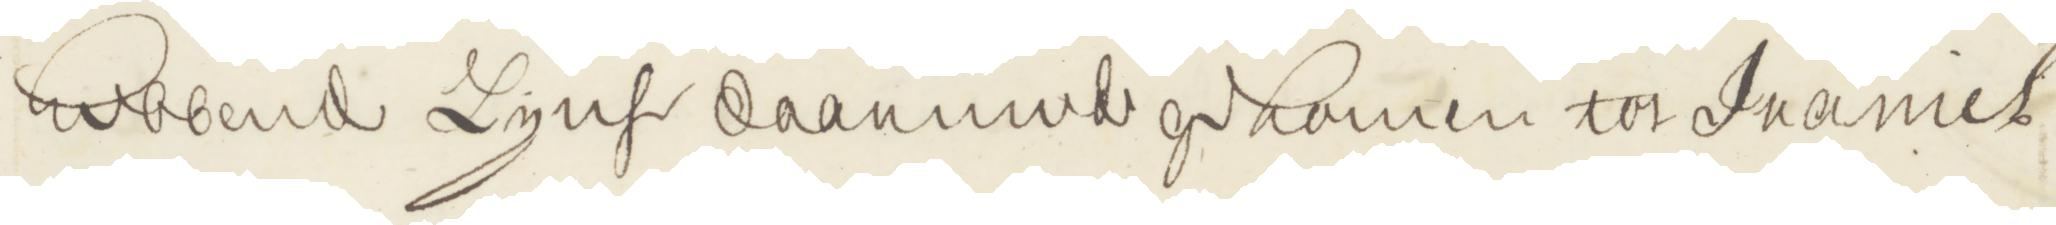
hebbende zijnse daarmede gekomen tot Iraniel
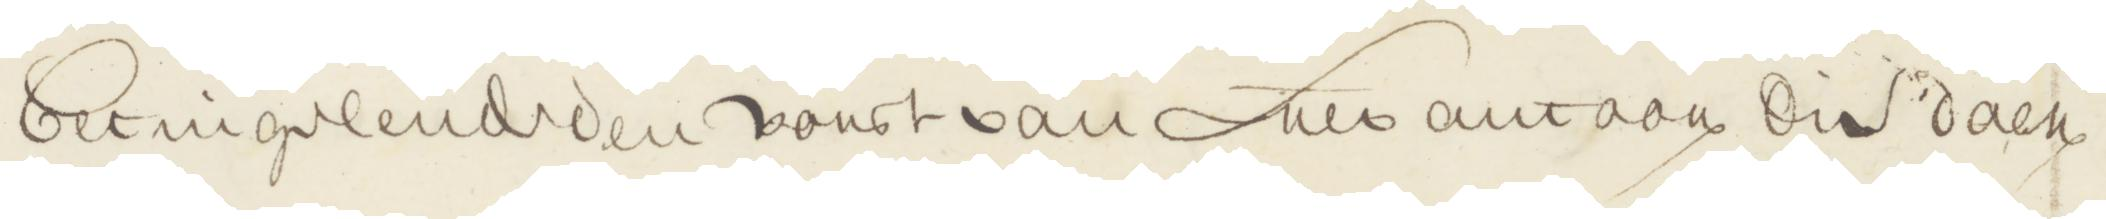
becingelende den vorst van Trevancoor die daer
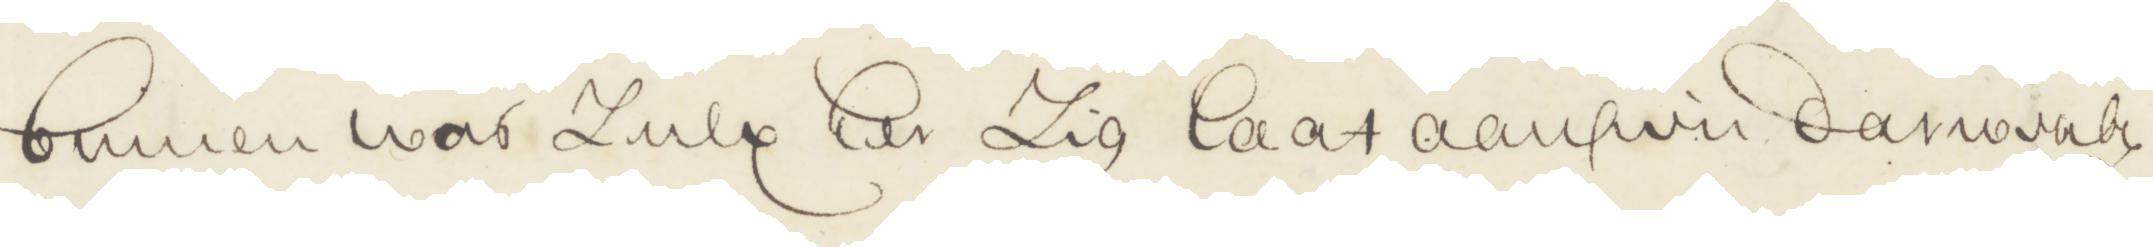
binnen was zulx het zig laat aansein dat werk
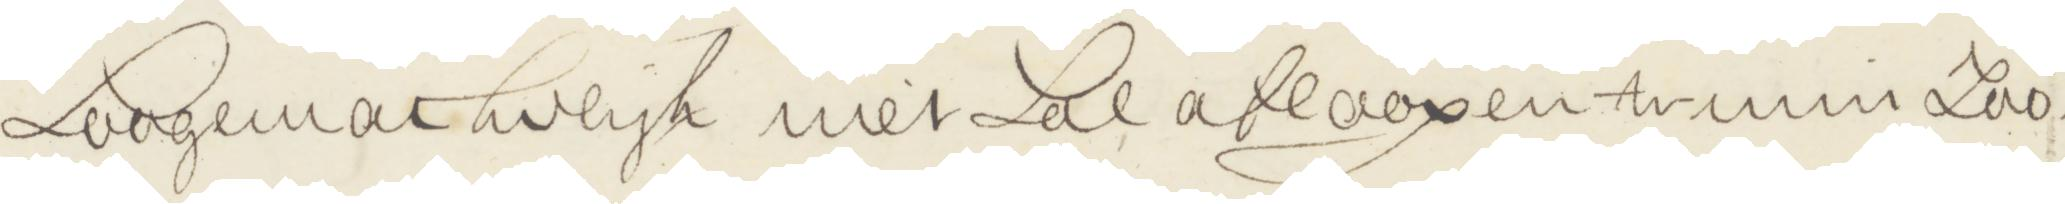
zoogemackelijk niet zal afloopen te min zoo
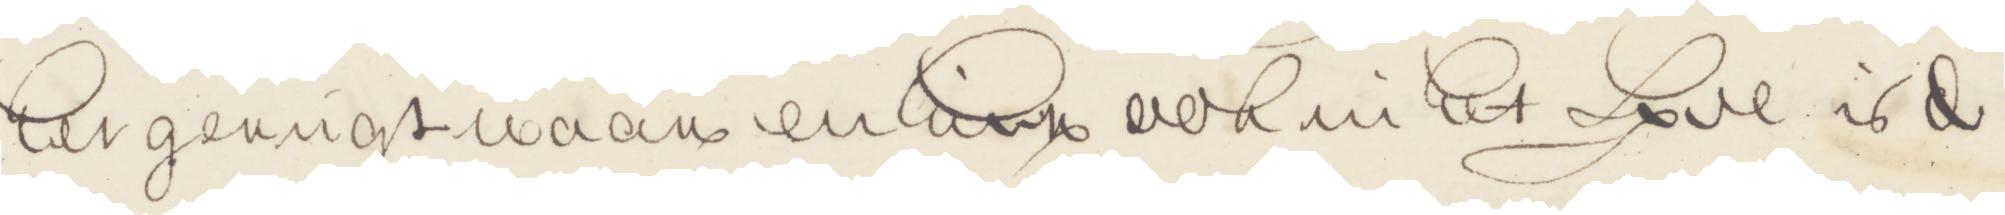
het gerugt waar en hier ook in het spel is de
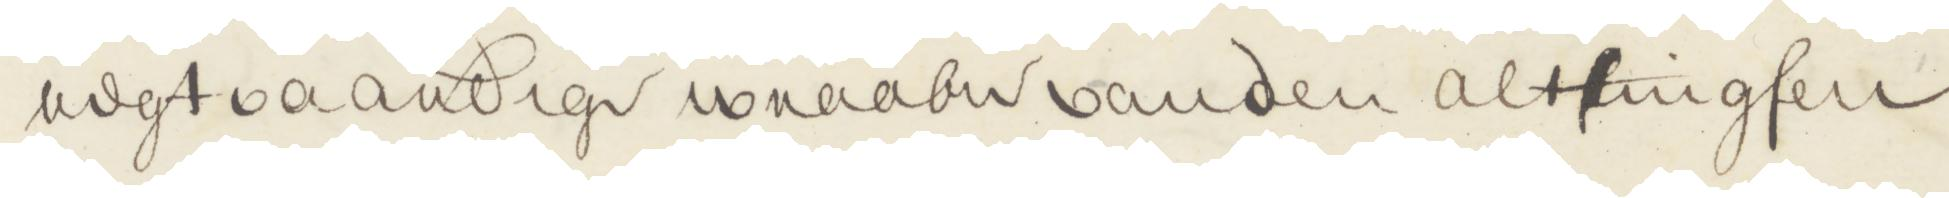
regtvaardige wraake van den alttingsen
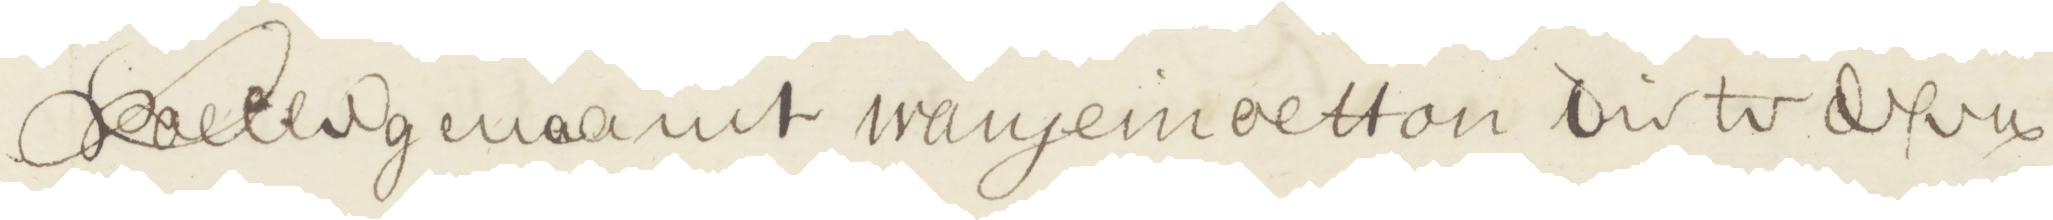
Roelle genaamt wanjemoetton die te deser
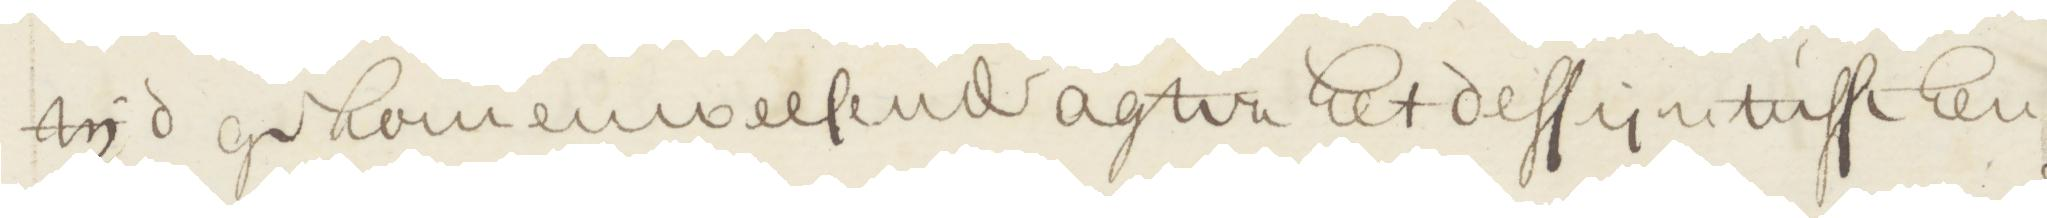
tijd gekomen weesende agter het dessijn tusschen
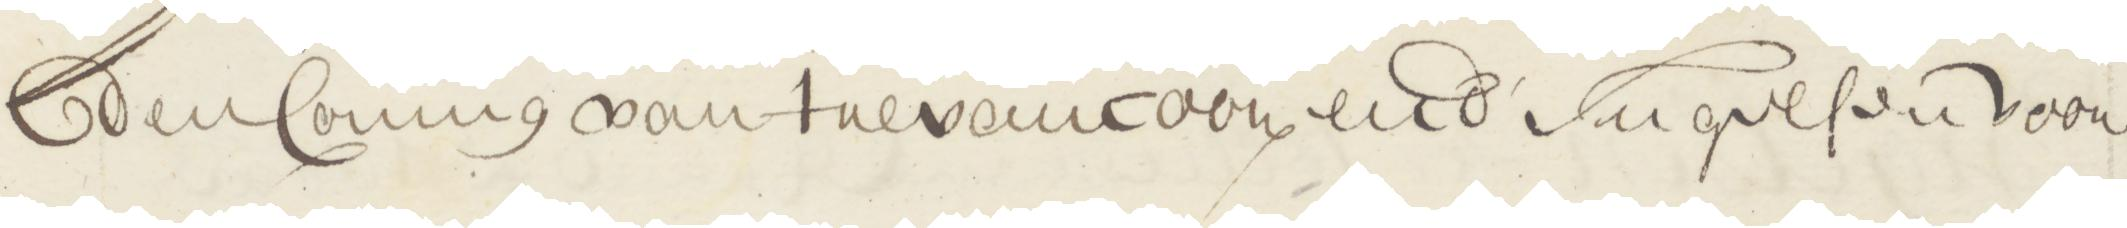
den Coning van trevancoor end’ Engelsen voor
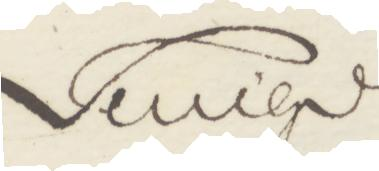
Eenige
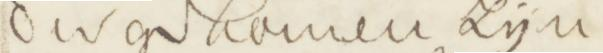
die gekomen zijn
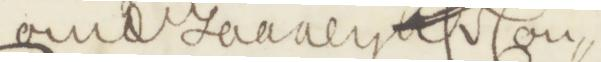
om de Iaarlijkse Con„
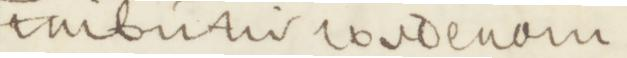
tributie wederom
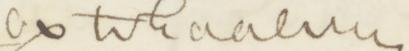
op tehaalen
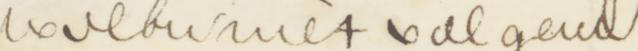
welke niet volgende
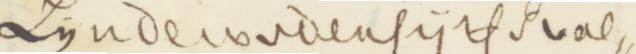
zijn de wedersijtse vol„
